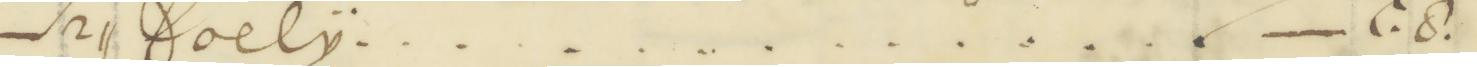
— ½ „ foelij . . . . . . . . . . . . . . ƒ — 5. 8.
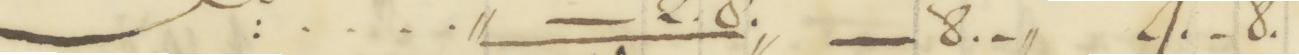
_:o . . . . „ — 2. 8. „ — 8. - „ 4. - 8.
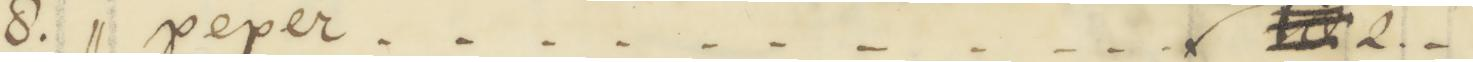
8. „ . . . . . . . . . . . peper ƒ — 2. -
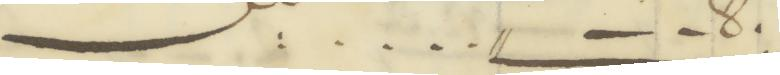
_:o . . . . „ — - 8.
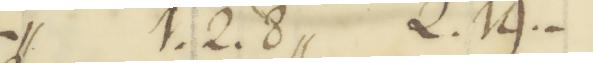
„ 1. 2. 8 „ 2. 19. -
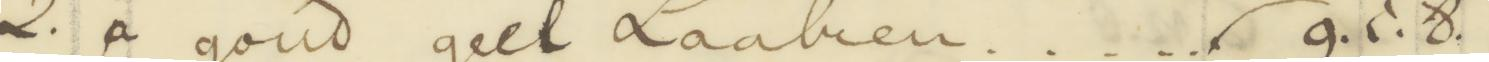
2. â goud geel Laaken . . . . . ƒ 9. 5. 8.
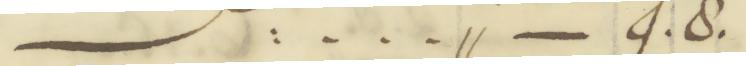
_:o : . . . „ — 4. 8.
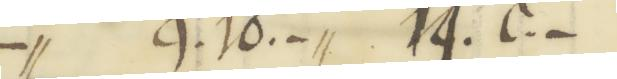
„ 9. 10. - „ 14. 5. -
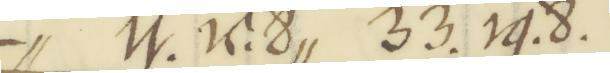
„ 11. 15. 8 „ 33. 14. 8.
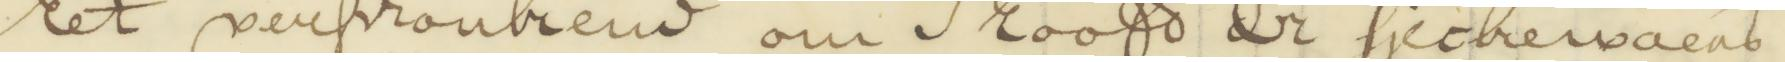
het verschonkene om 'T hoofd der sjeckewaers
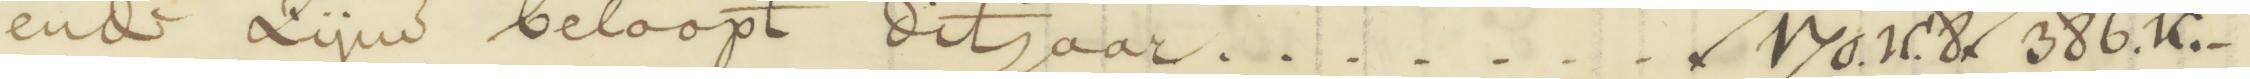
ende Zijne beloopt ditjaar . . . . . . . ƒ 170. 15. 8ƒ 386. 15. -
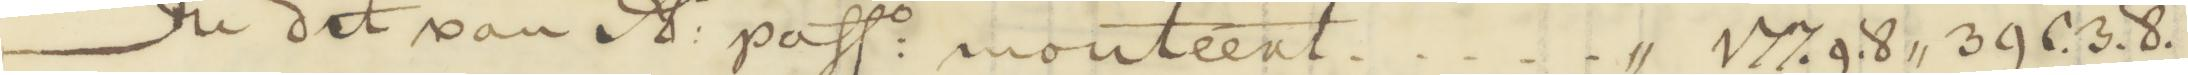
en dit van A:o pass:o monteert . . . . . „ 177. 9. 8 „ 395. 3. 8.
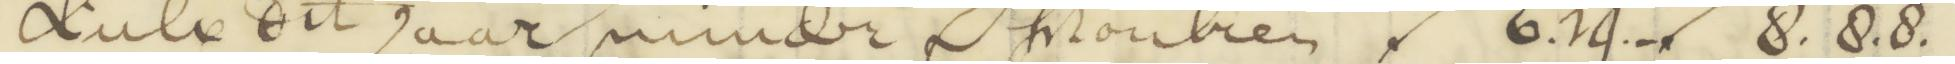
Zulx dit jaar minder verschonken ƒ 6. 14. - ƒ 8. 8. 8.
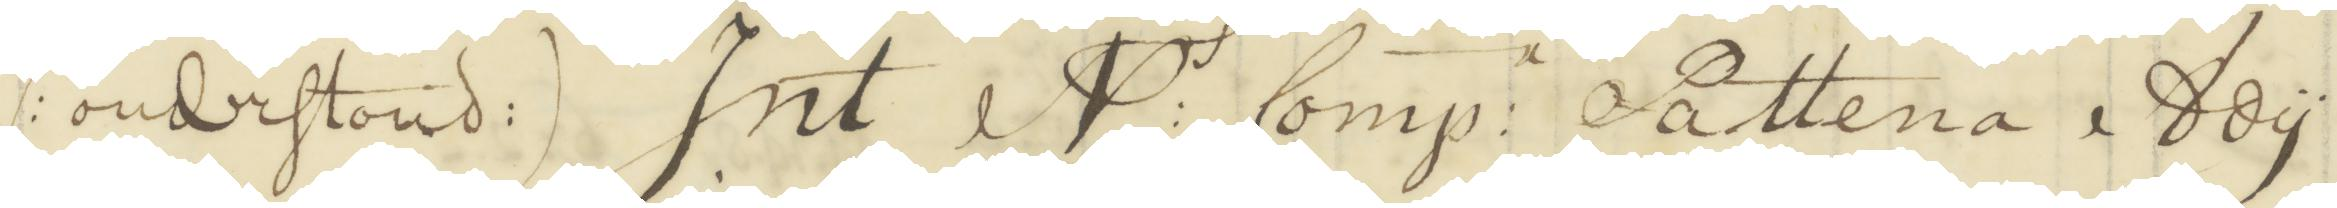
(:onderstond:) In't N:s Comp:r Pattena Adij
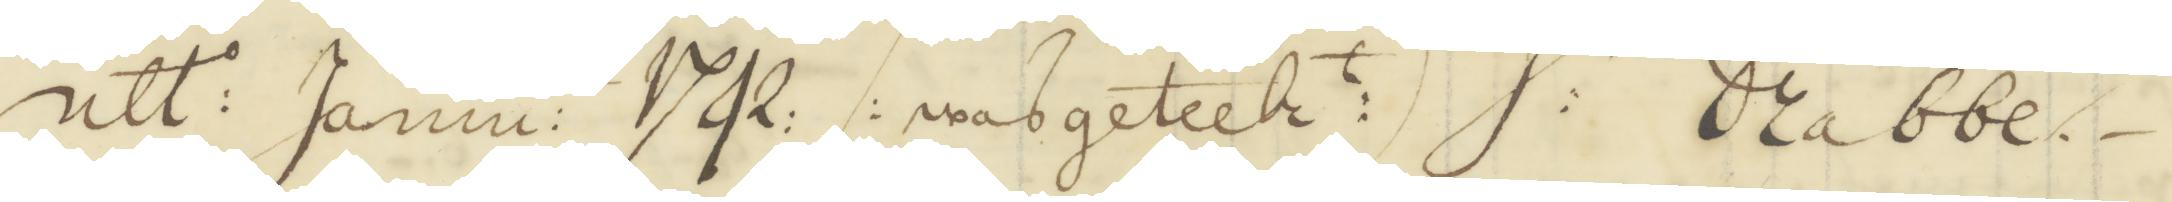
ult:o Janu: 1742: (:was geteekt:) J:r Drabbe. -
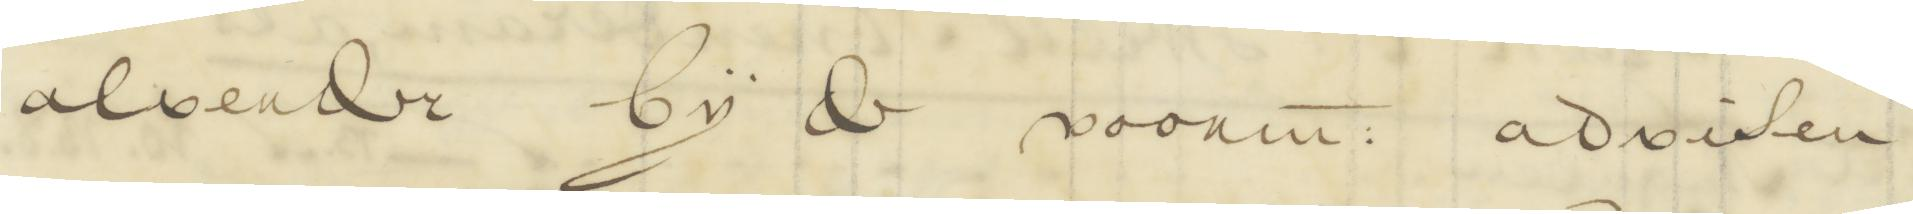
alverder bij de voorm: advisen
